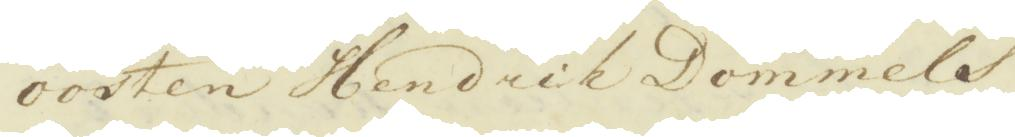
oosten Hendrik Dommels
